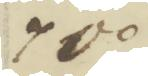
7 do
